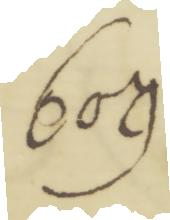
609
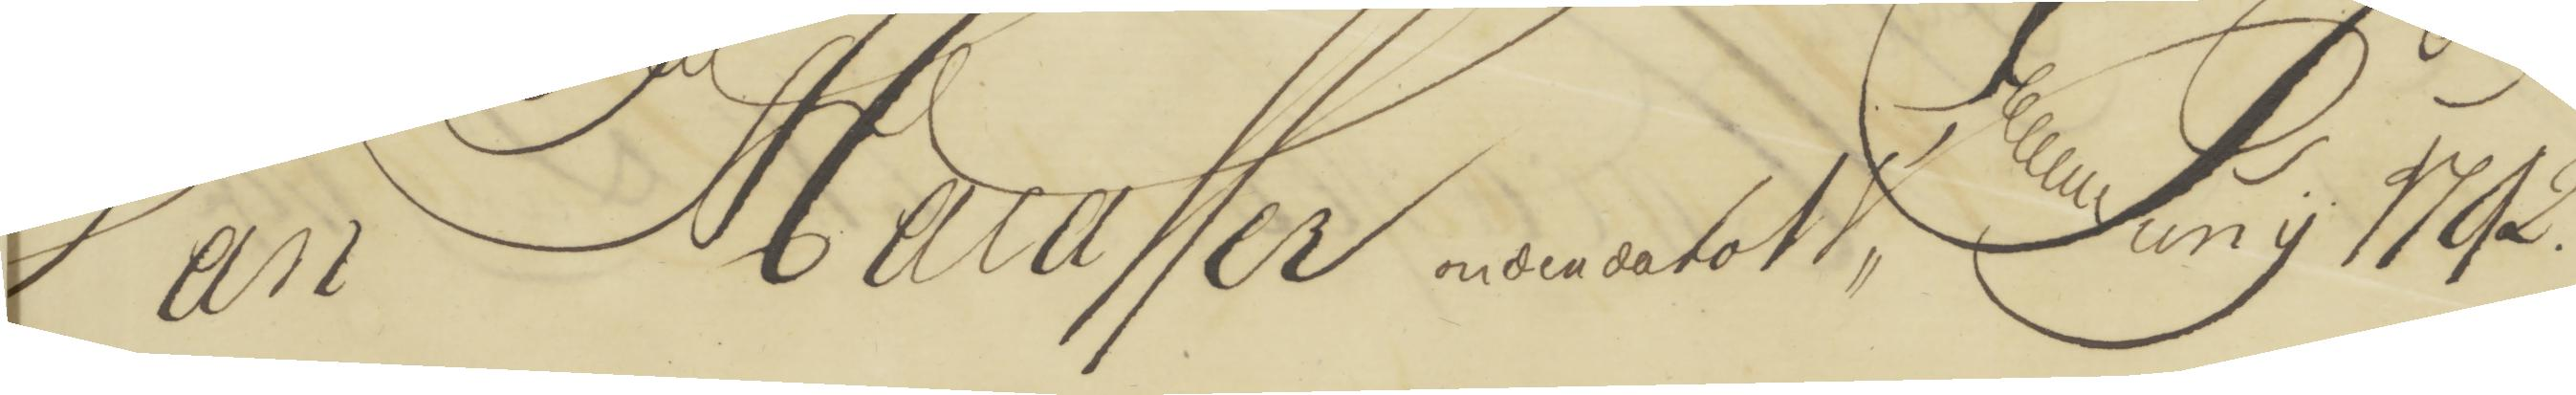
Van Macasser onder dato 11„' Iunij 1742.
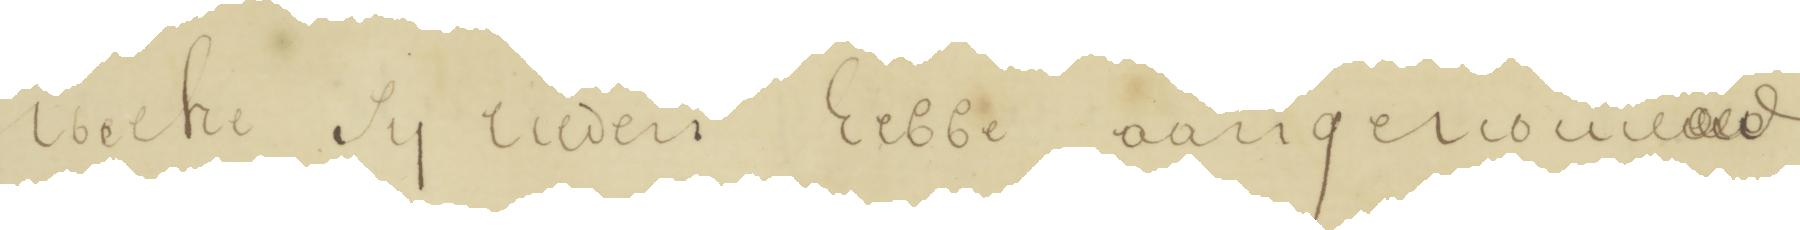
welke sy lieden hebbe aangenomene
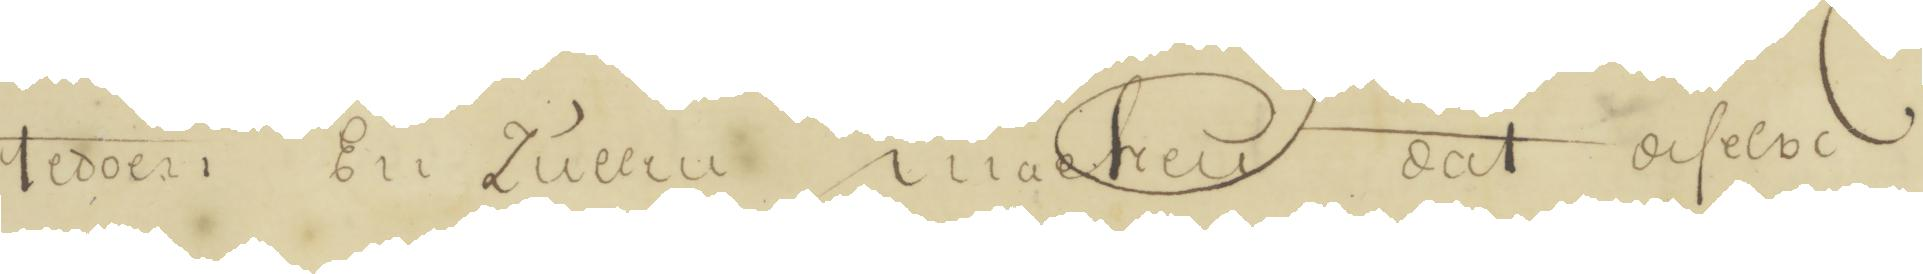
tedoen En zullen maeken dat deselve
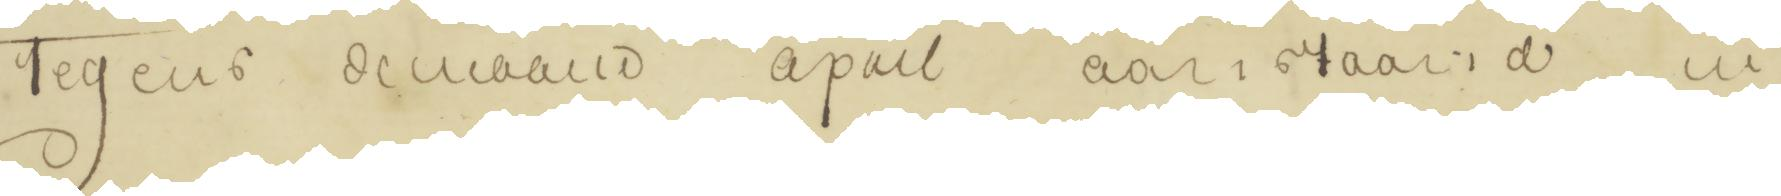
tegens demaand april aanstaande in
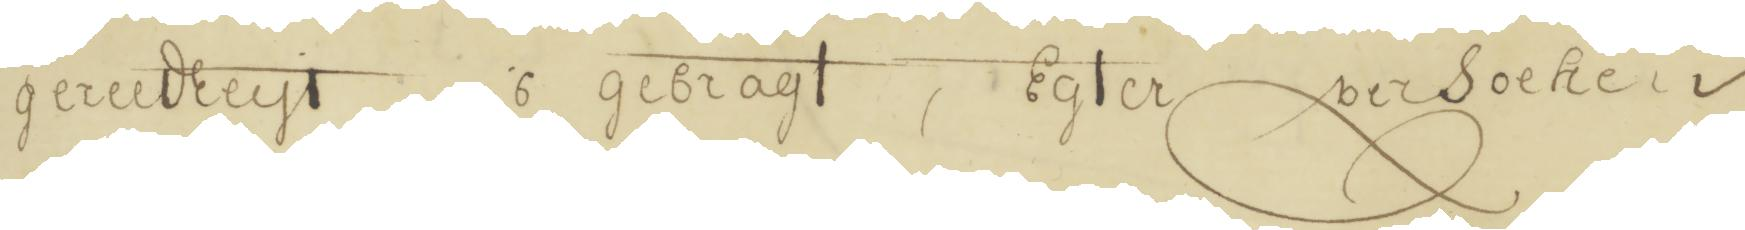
gereedheyt is gebragt, Egter versoeken
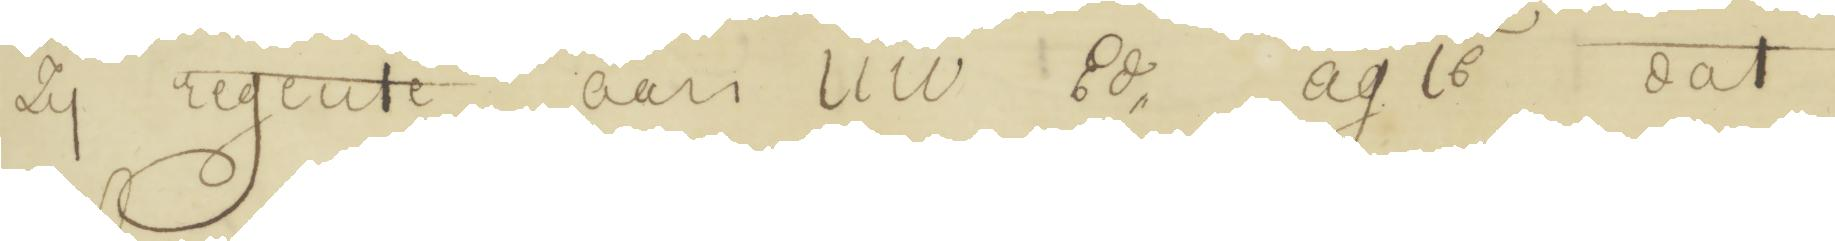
zij regente aan UW Ed„ agtb dat
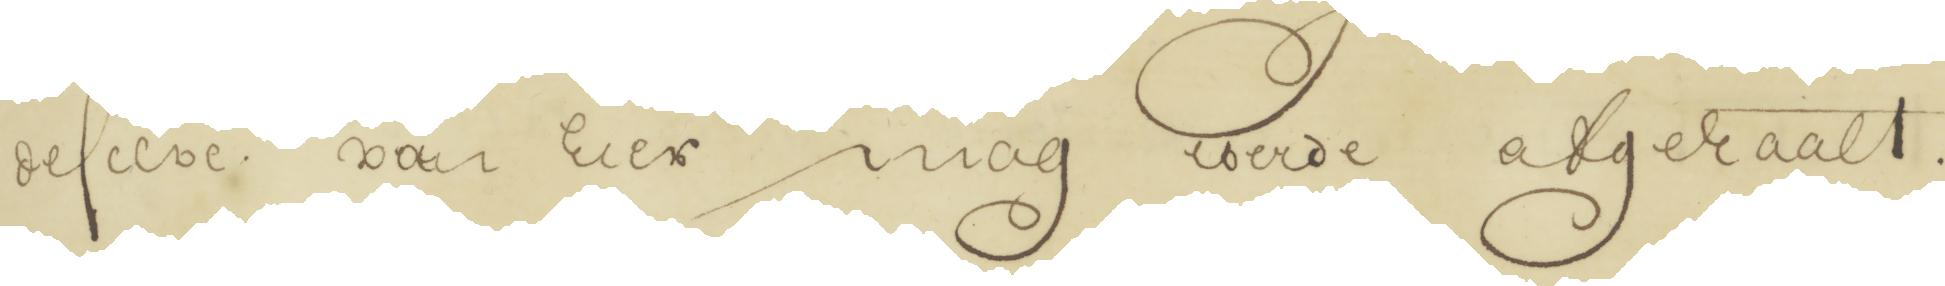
deselve van hier mag werde afgehaalt.
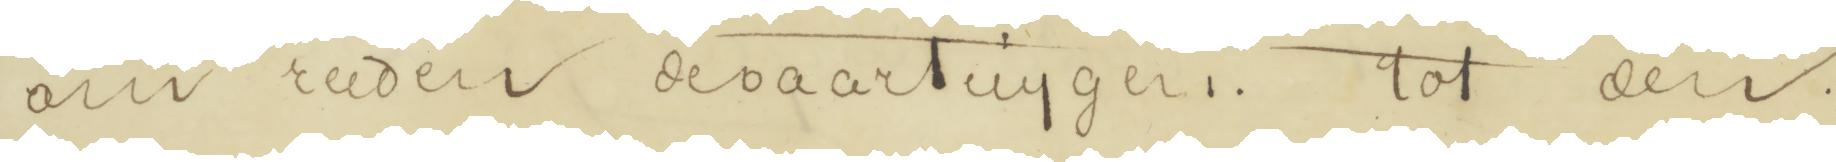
om heden de vaartuygen. tot den.
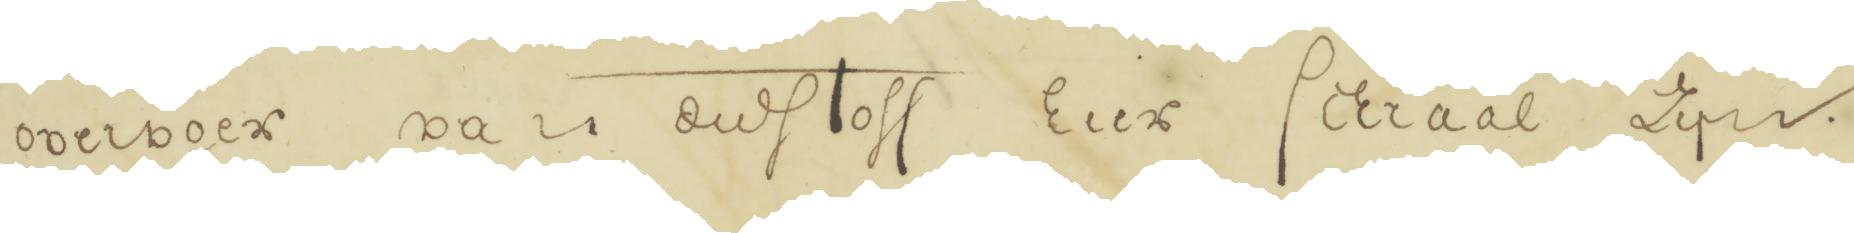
overvoer van diestoff hier schraal zyn.
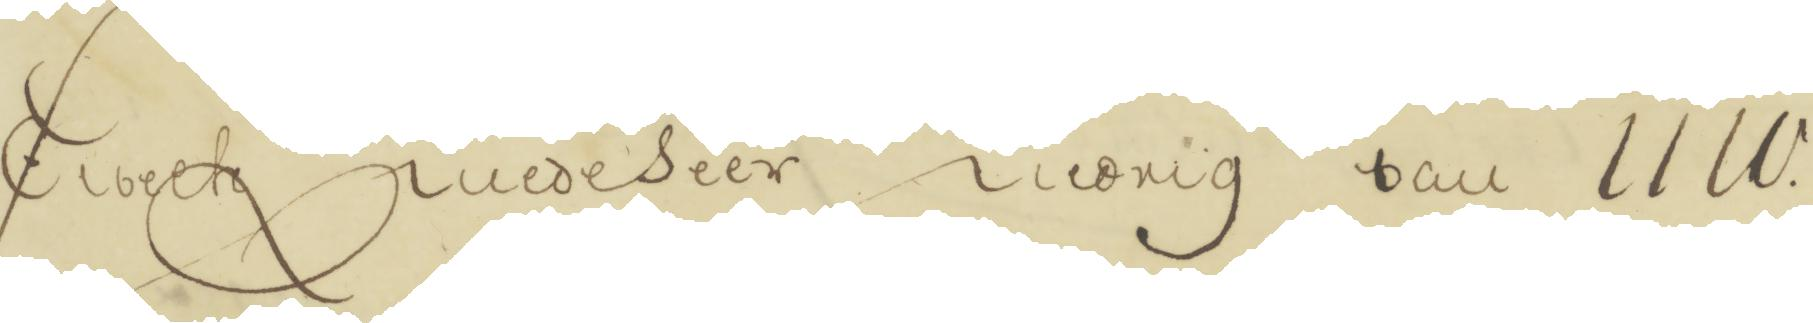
'Twelk mede seer nedrig van UW.
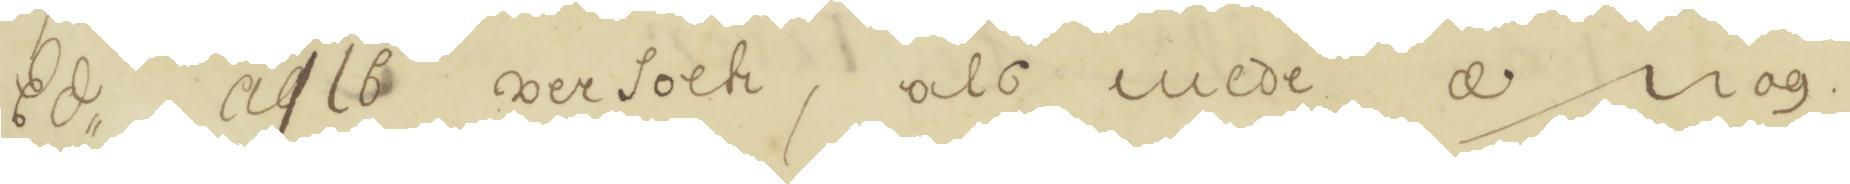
Ed„ agtb versoek, als mede de nog
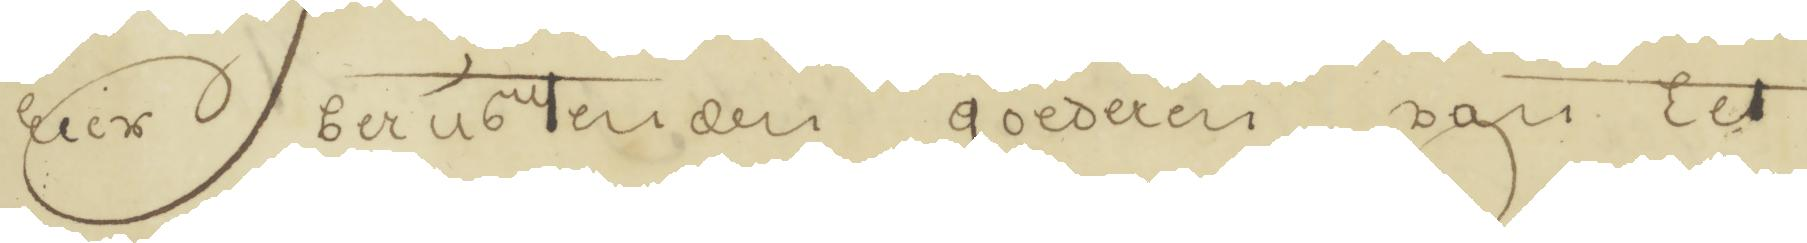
hier berustenden goederen van het
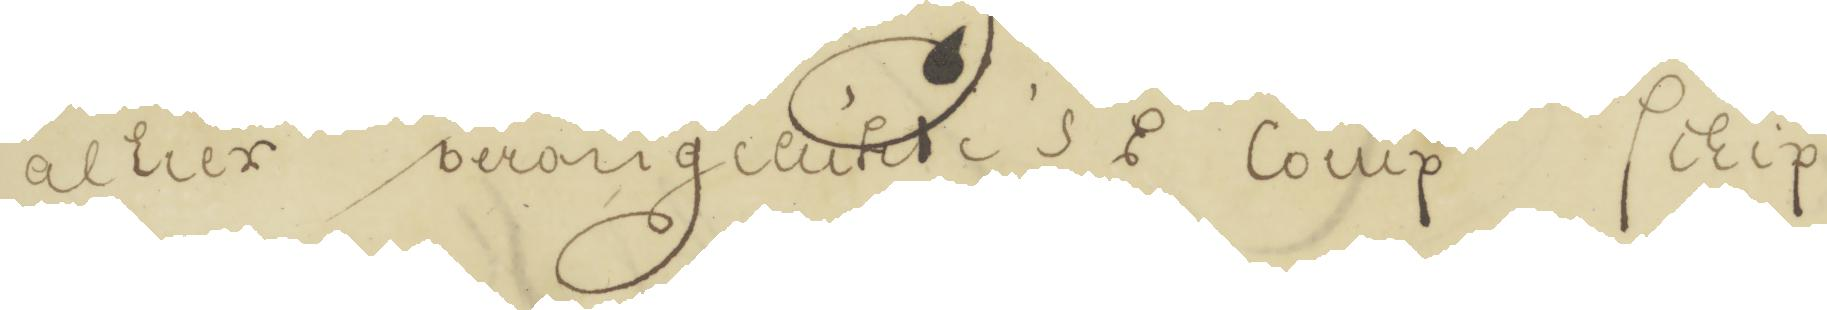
alhier verongelukte 's E Comp schip
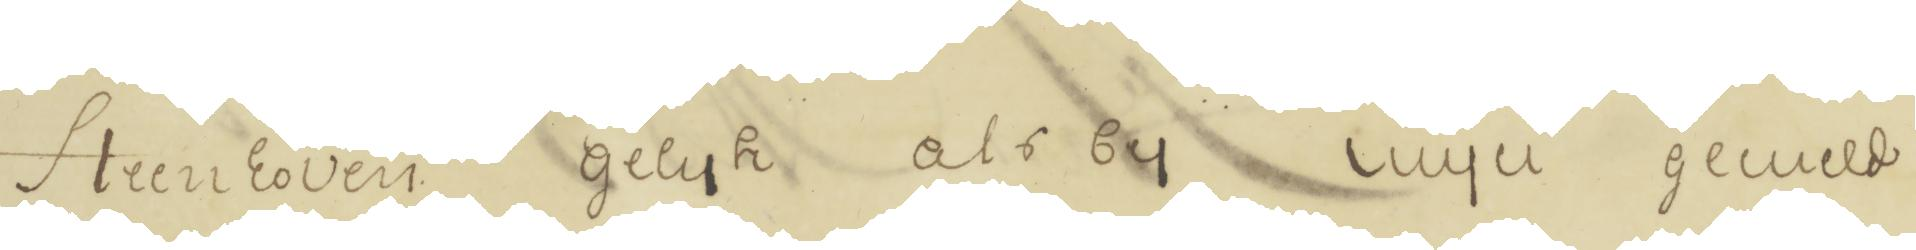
steenhoven gelyk als by myn gemeld
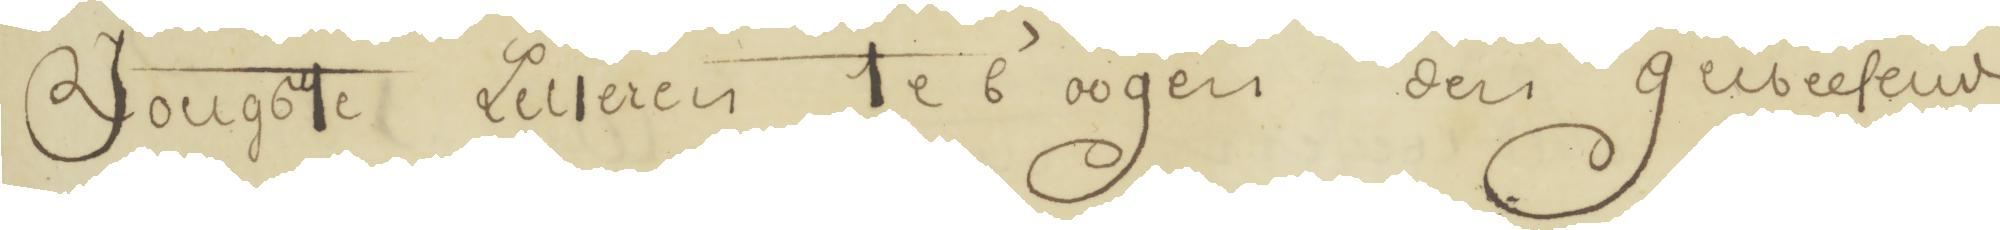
Jongste Letteren te b' oogen den geweesene
